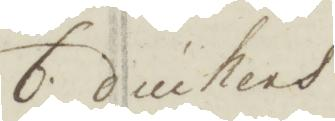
6. duikers
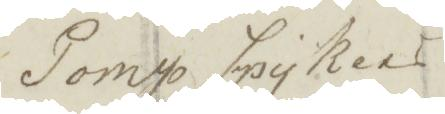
Pomp spijkers
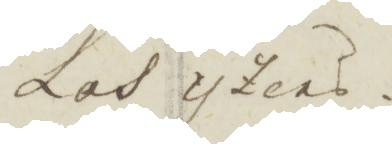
Las yzers
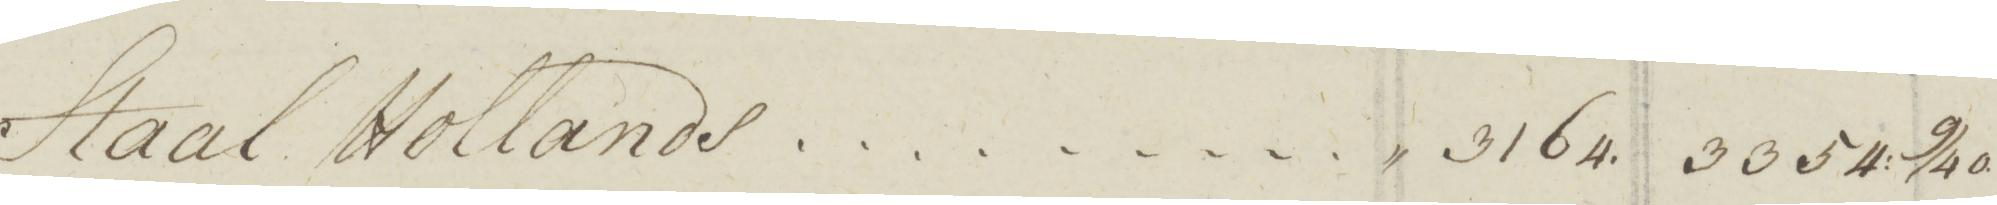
Staal Hollands - - - - - - - - - „ 3164. 3354: 9/40
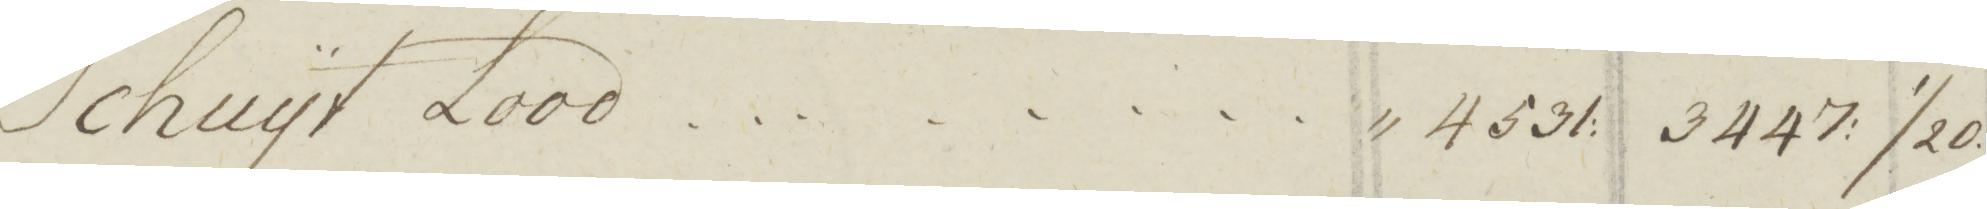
Schuijt Lood - - - - - - - - „ 4531: 3447: 1/20
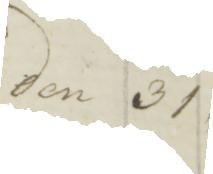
den 31„e
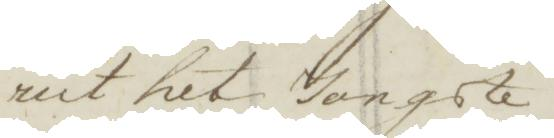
uit het Iongste
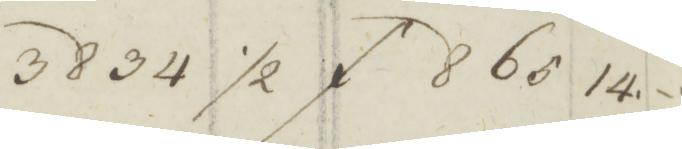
3834 ½ ƒ 865 14. —
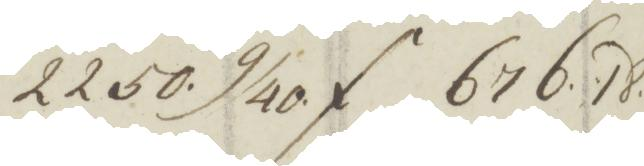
2250. 9/40. ƒ 676. 18:8
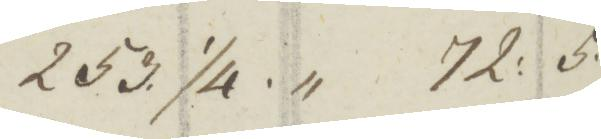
253. ¼ . „ 72: 5
